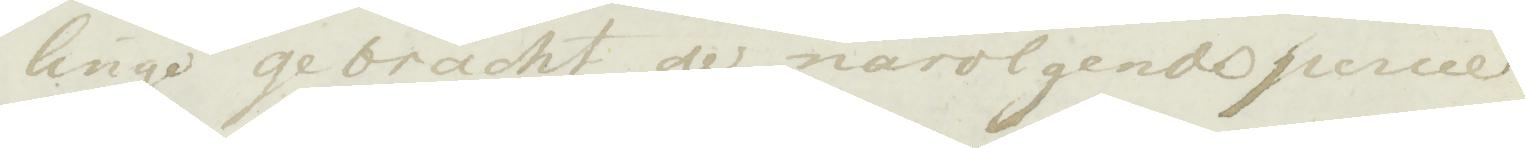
linge gebracht de navolgende percee
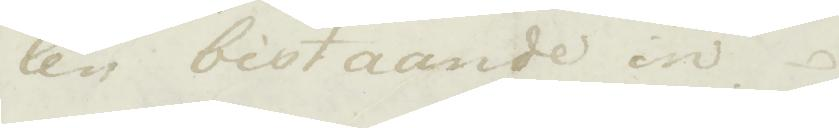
len bestaande in
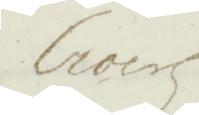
Croers
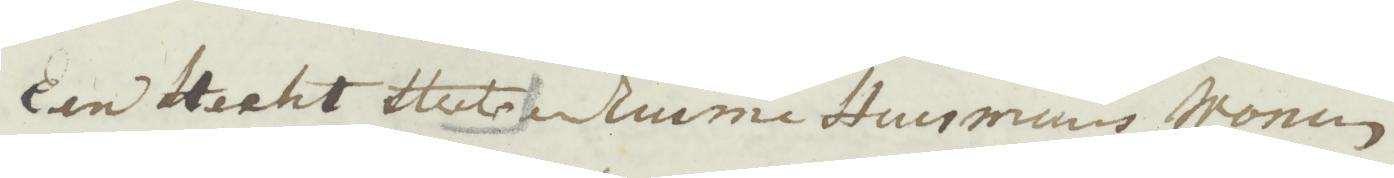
Een hecht sterke en ruime Huismans Woning
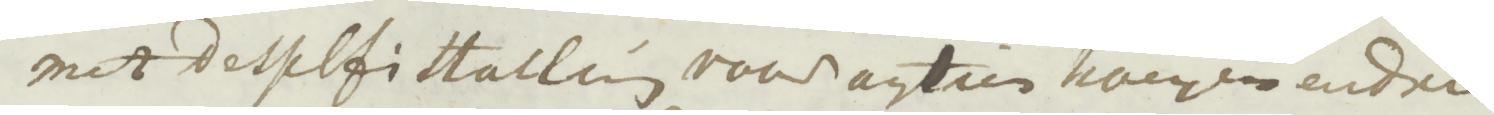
met desselfe stallen voor agtien koeyen en drie
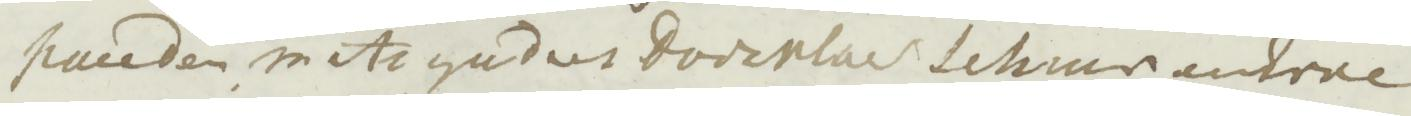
paerden mits gaders doorvlae schuur en drie
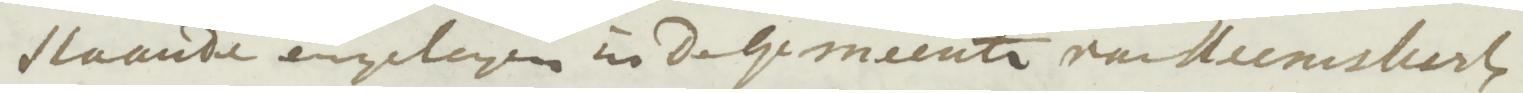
staande en gelegen in de gemeente van Heemskerk
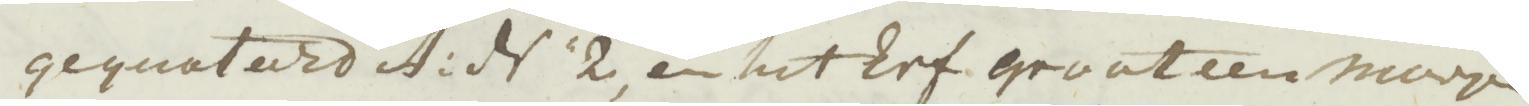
gequoteerd A:. N '2, en het Erf groot een morgen
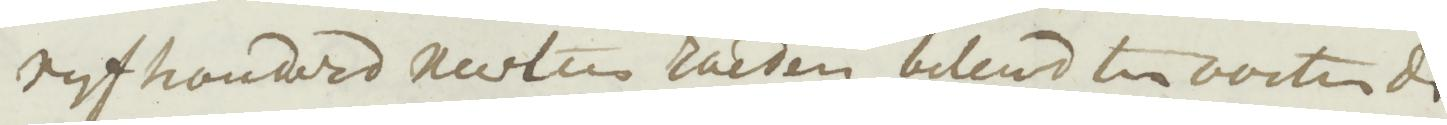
vyfhonderd zestien roeden belend ten oosten de
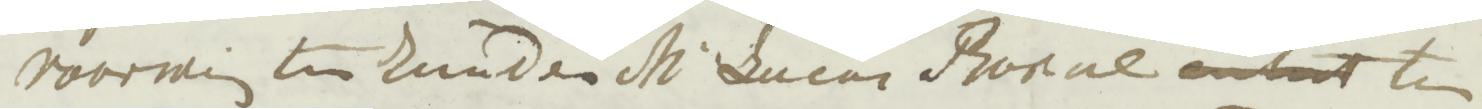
voorsten ten zuiden M' Lucas Boral entot ten
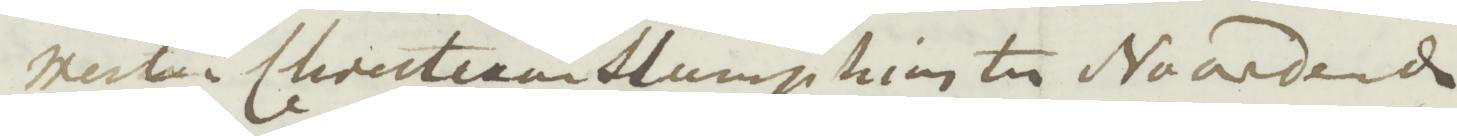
westen Christiaan Hamphius ten Noordend
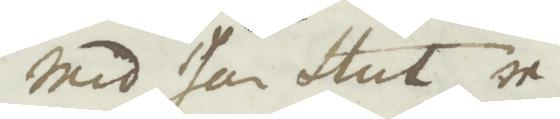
Wed Jan Hut, sr
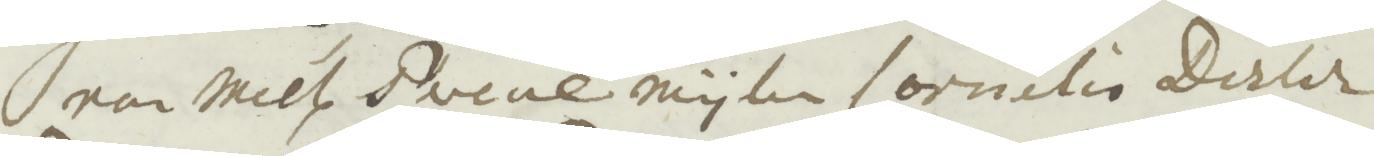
van neef Preal wijlen Cornelis Derter
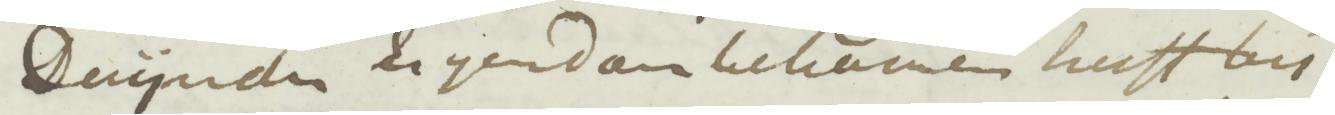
Duijn den Eygendom bekomen heeft bij
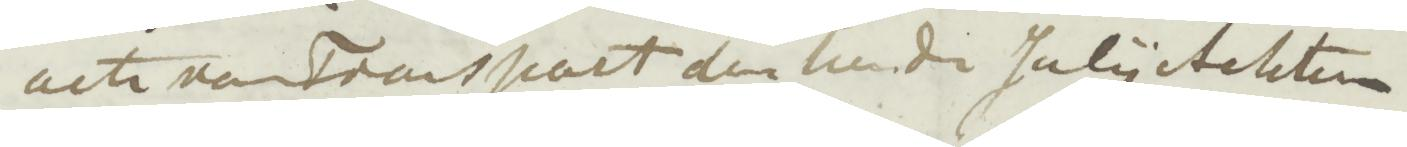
acte van Transport den tiende Julij Achtien
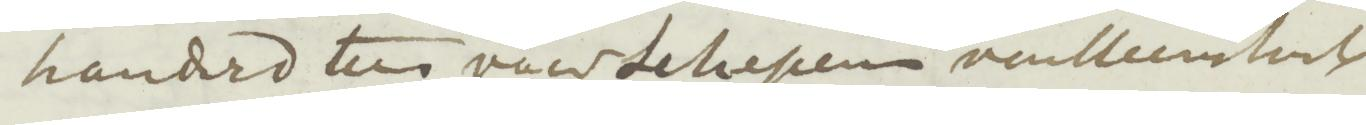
honderd tien voor schepen van heemskerk
